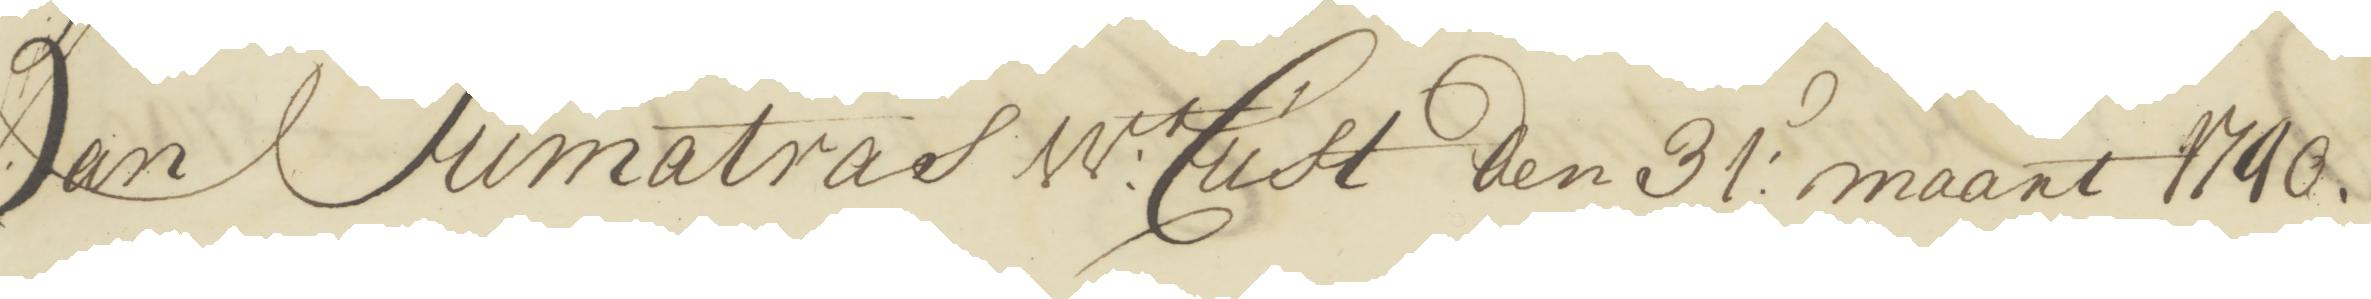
Van Sumatras w:t Cust den 31:' maart 1740.
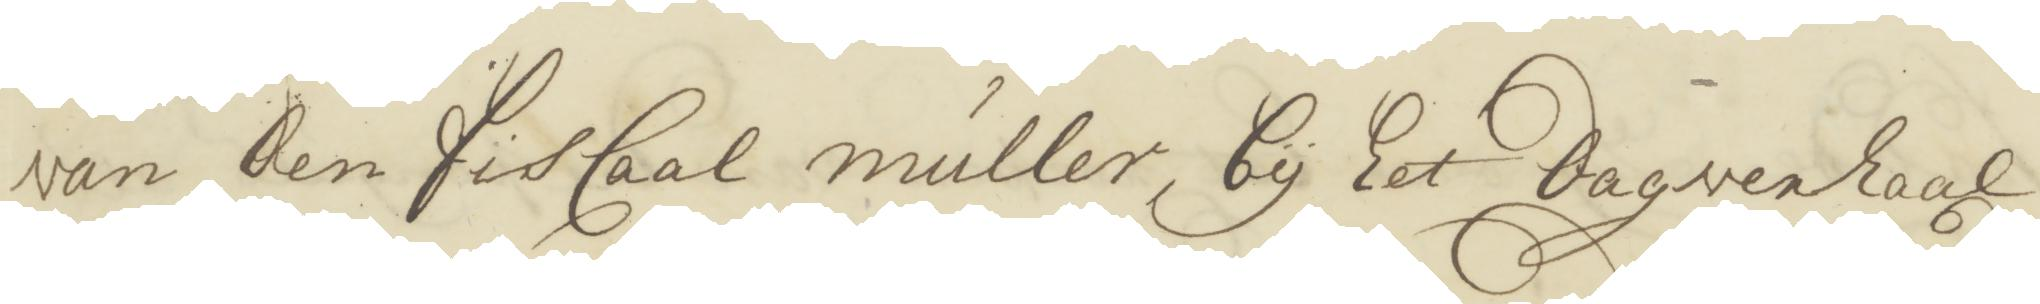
van den fiscaal muller, bij het dagverhaal
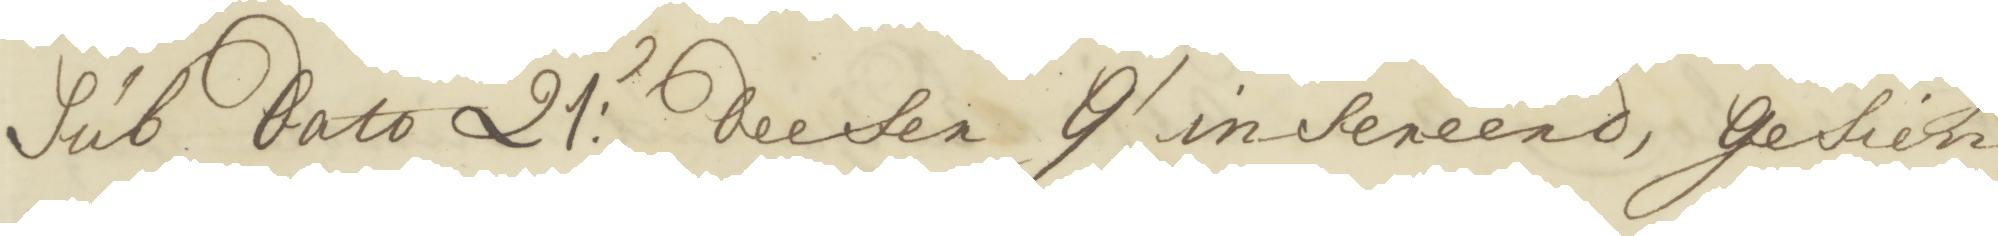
sub dato 21:' deeser g'insereerd, gesien
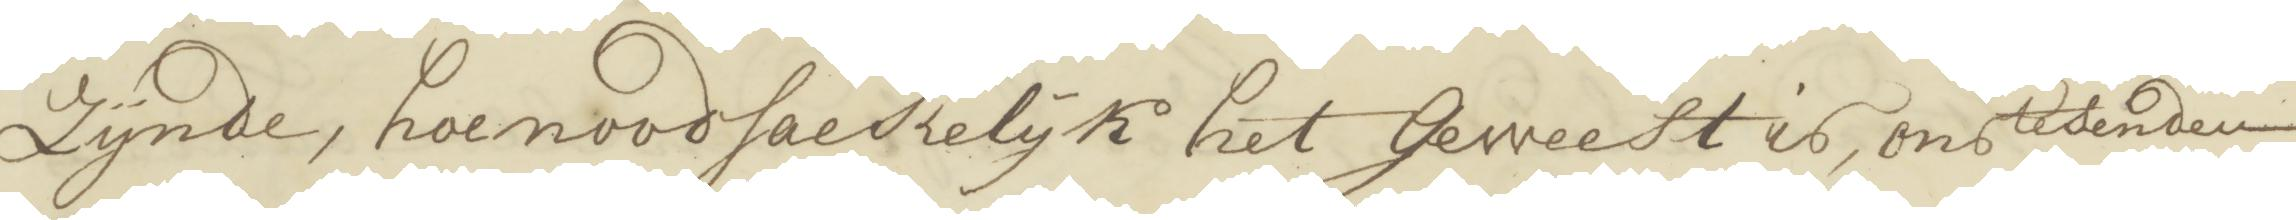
zijnde, hoe noodsaekelijk het geweest is, ons tesenden
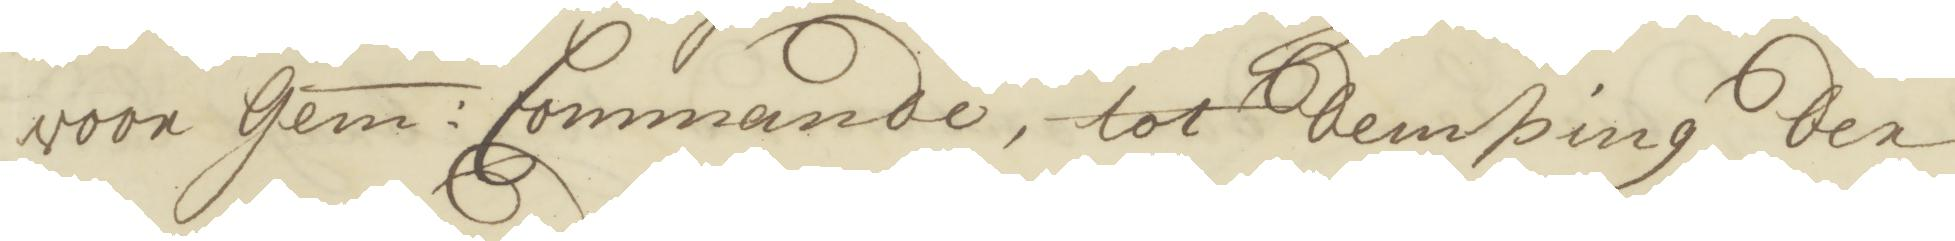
voor gem: Commande, tot demping der
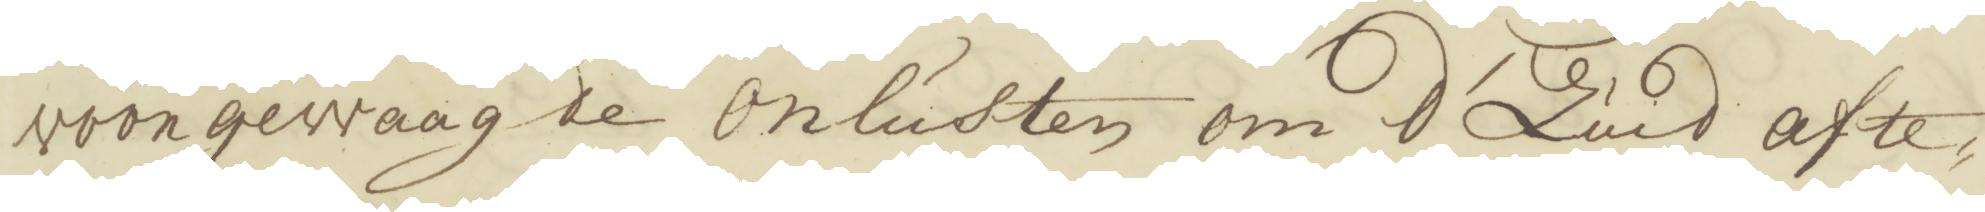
voor gewaagde onlusten om d'zuid afte
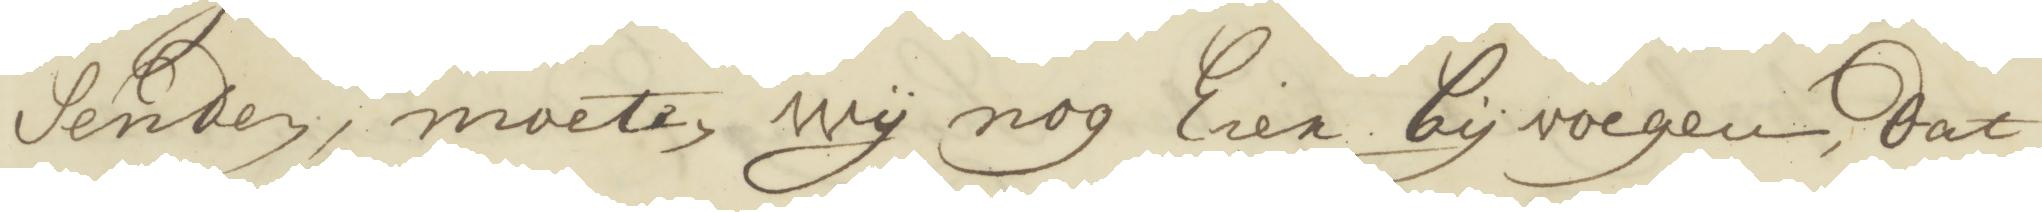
senden, moeten wij nog hier bij voegen, dat
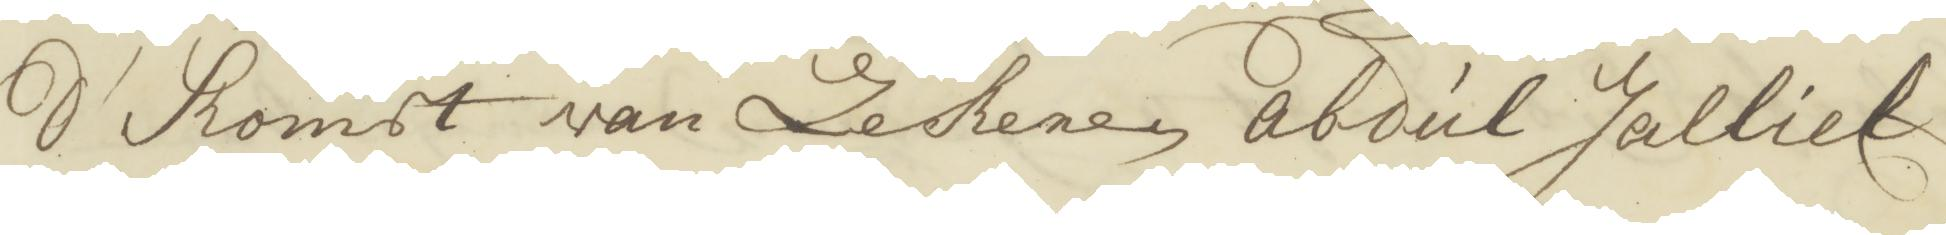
d’ Komst van zekeren abdul Jalliel
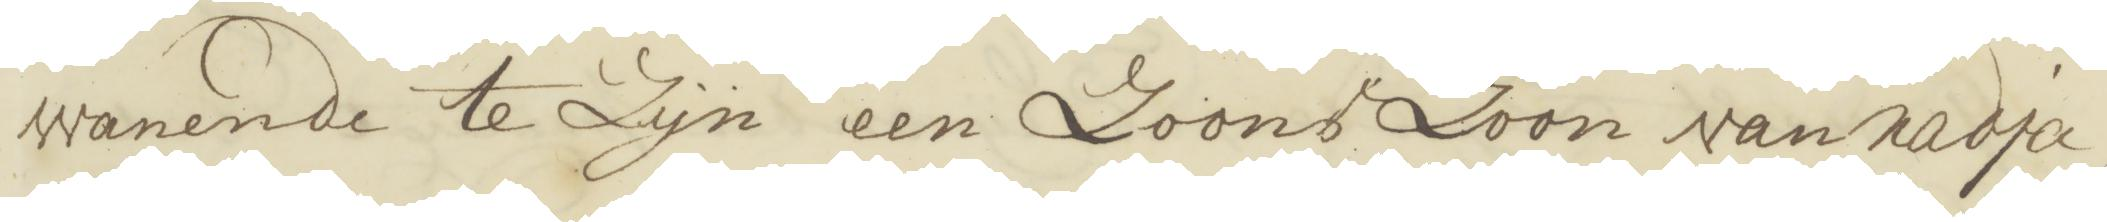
wanende te zijn een zoons zoon van radja
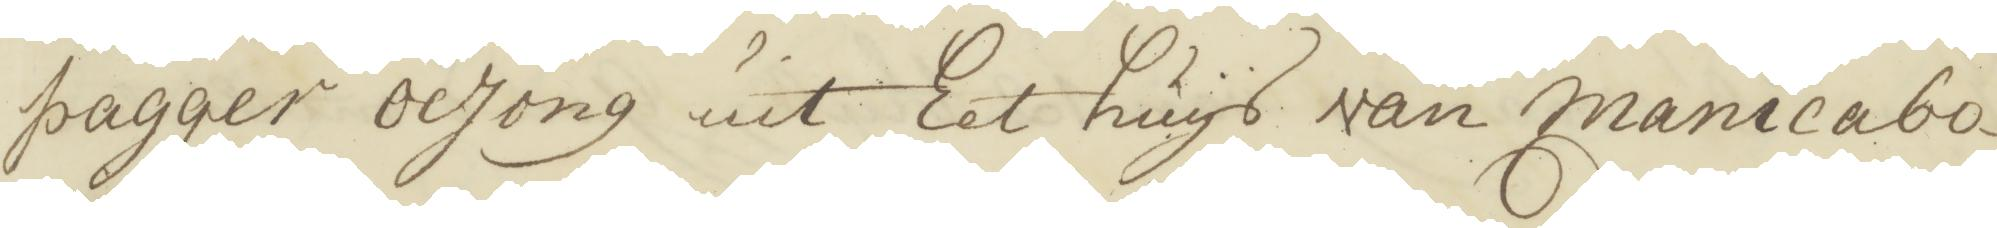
pagger oejong uit het huijs van manicabo
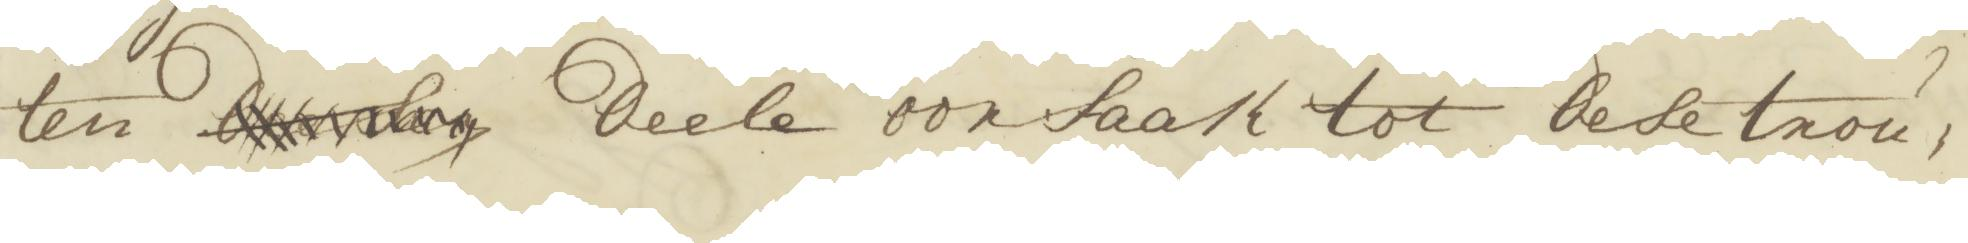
ten deelen deele oorsaak tot dese trou„
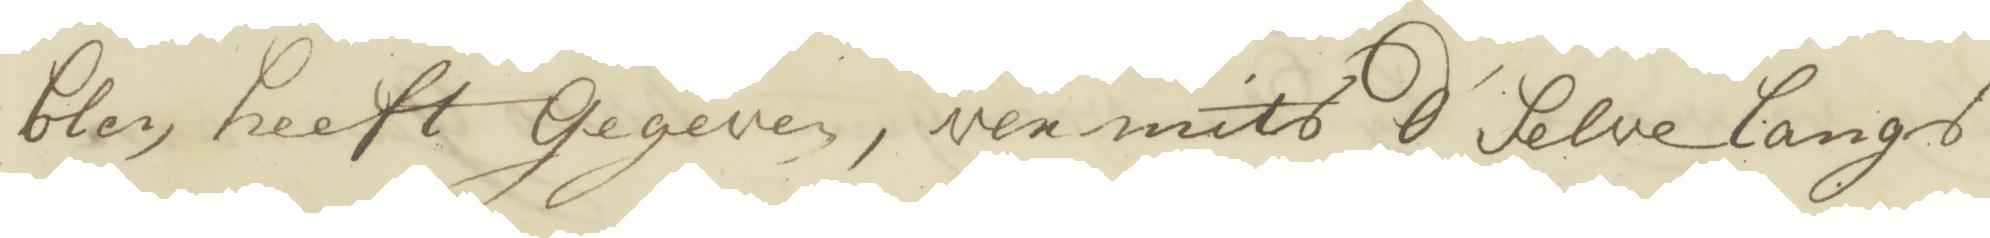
blen heeft gegeven, vermits d’selve langs
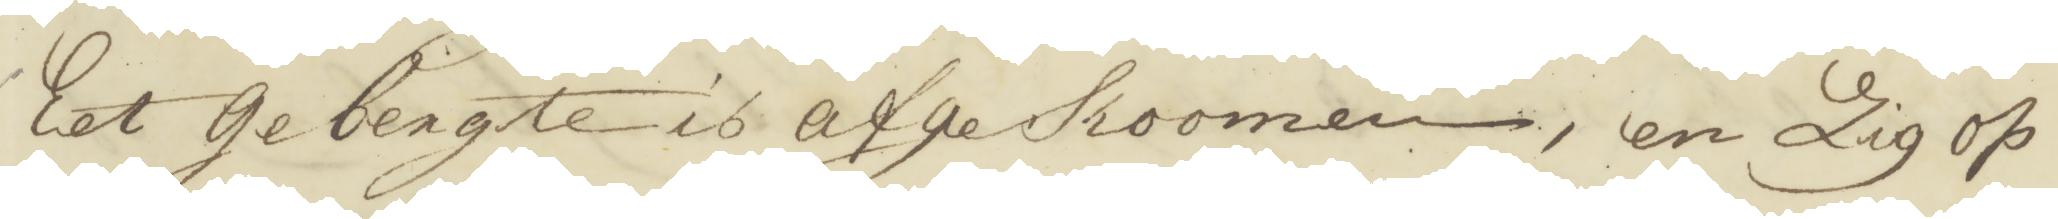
het gebergte is afgekoomen, en zig op
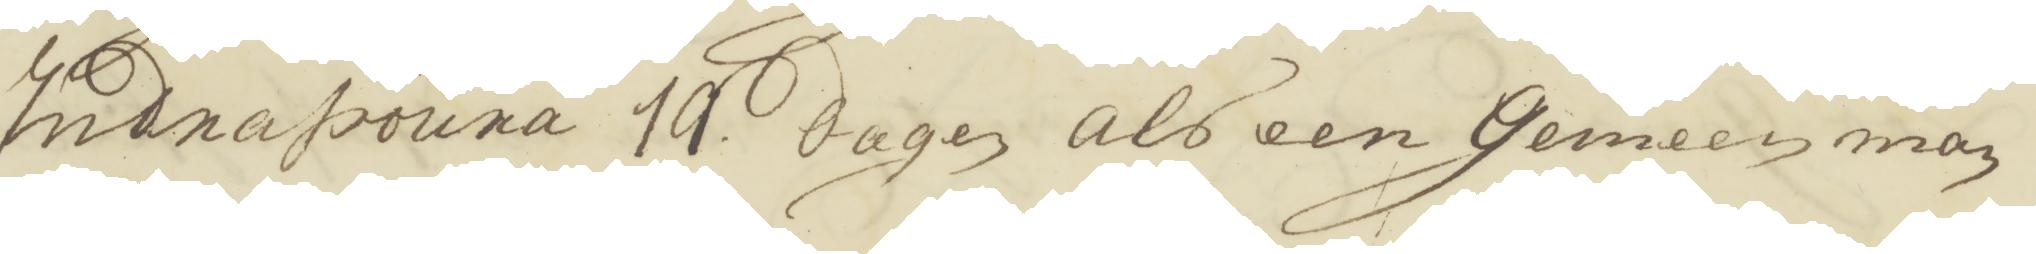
Jndrapoura 14: dagen als een gemeen man
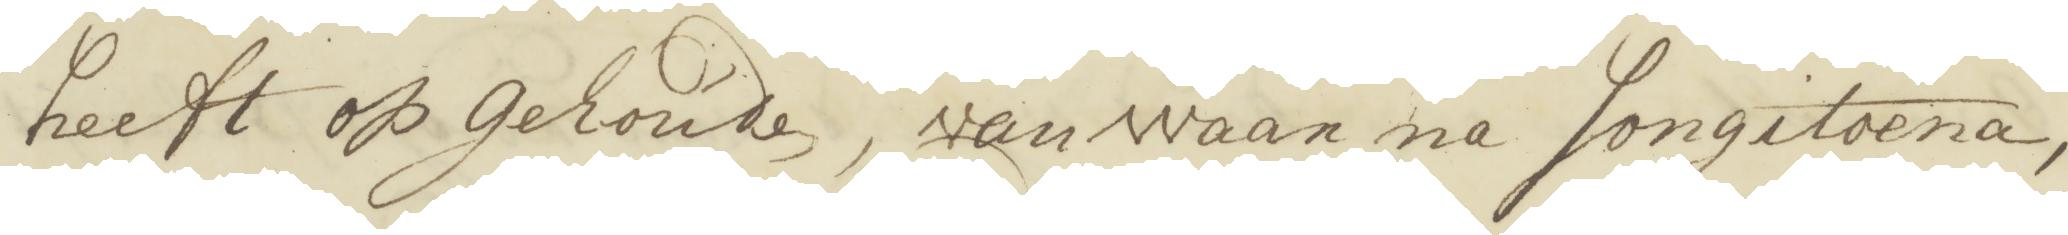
heeft op gehouden, van waar na Jongitoena,
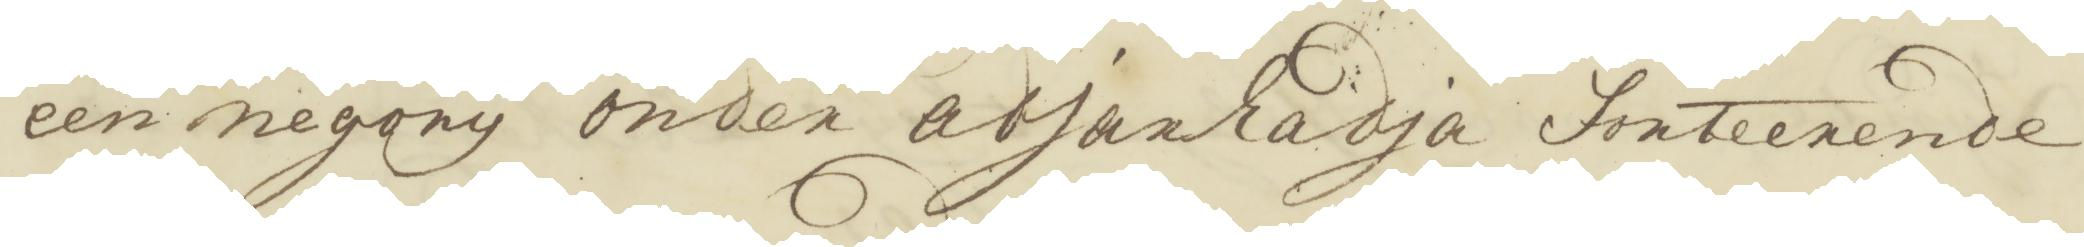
een negorij onder adjarhadja sorteerende
